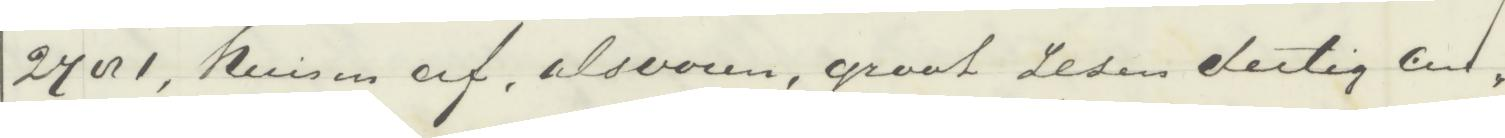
2781, huis en erf, alsvoren, groot zesen dertig cen„
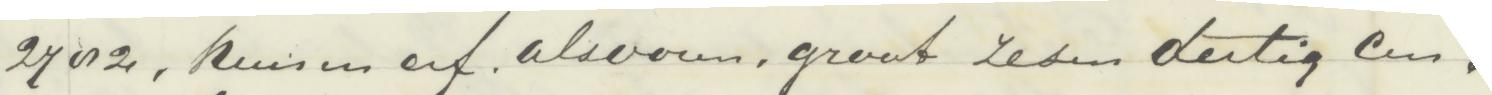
2782, huis en erf, alsvoren, groot zesen dertig cen„
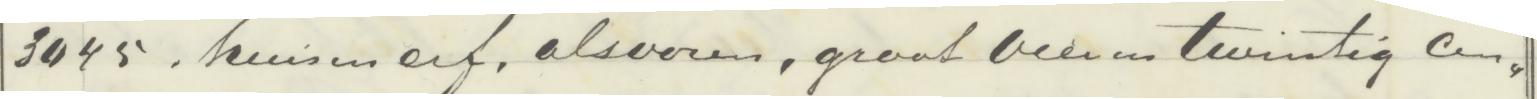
3045, huis en erf, alsvoren, groot vier en twintig cen„
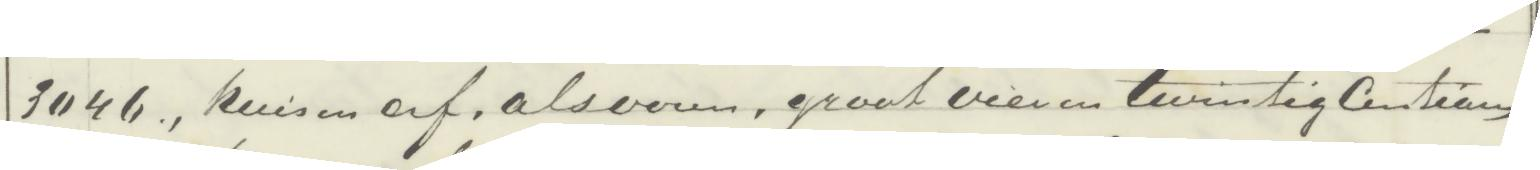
3046, huis en erf, alsvoren, groot vier en twintig centiaren
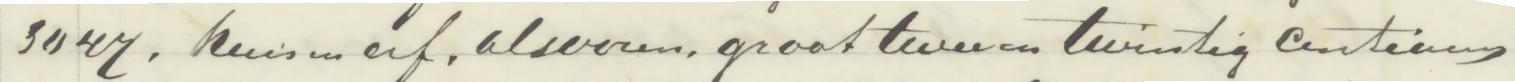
3047, huis en erf, alsvoren, groot twee en twintig centiaren
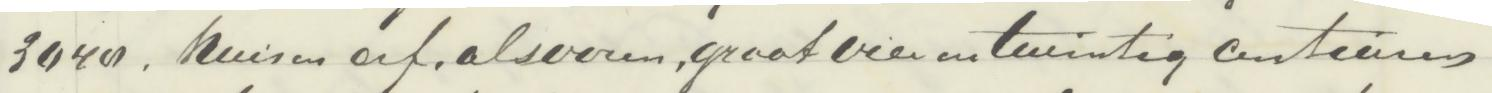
3048, huis en erf, alsvoren, groot vier en twintig centiaren
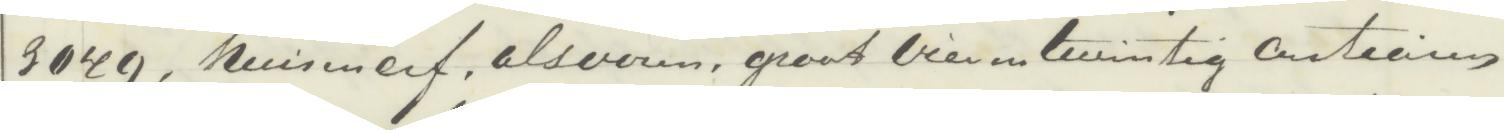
3049, huis en erf, alsvoren, groot vier en twintig centiaren
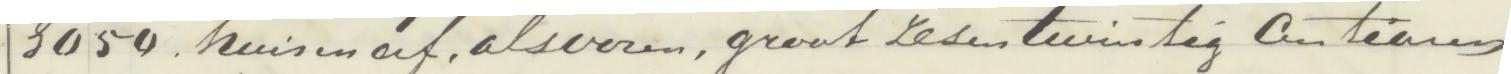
3050. huisen erf, alsvoren, groot zesen twintig centiaren
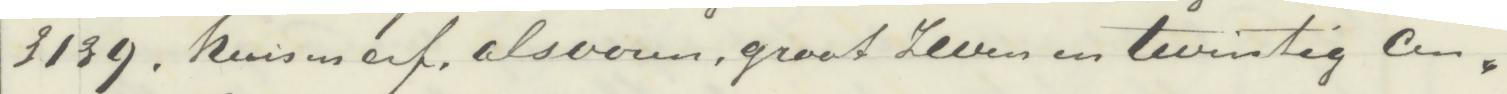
3139, huis en erf, alsvoren, groot zeven en twintig cen„
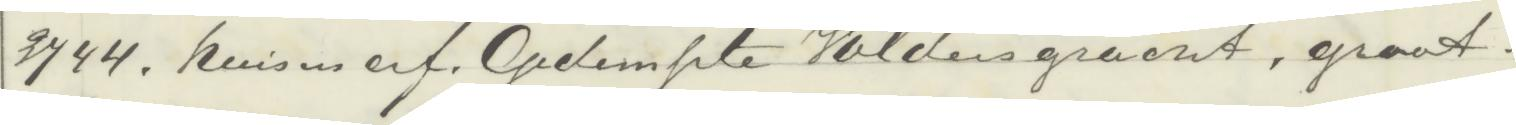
3744, huis en erf, Gedempte Voldersgracht, groot
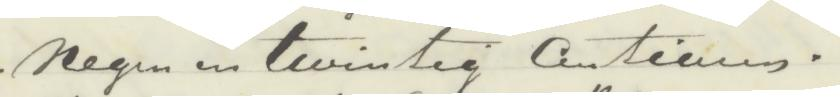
negen en twintig centiaren.
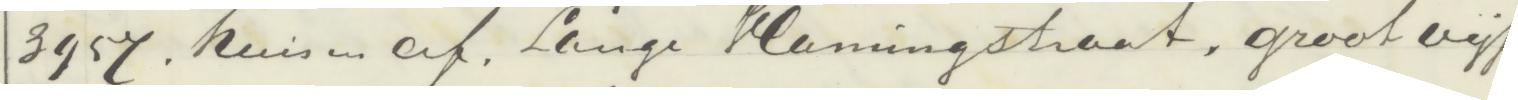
3957. huis en erf, Lange Vlamingstraat, groot vijf
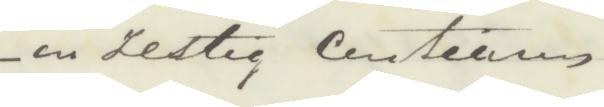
-en zestig centiaren
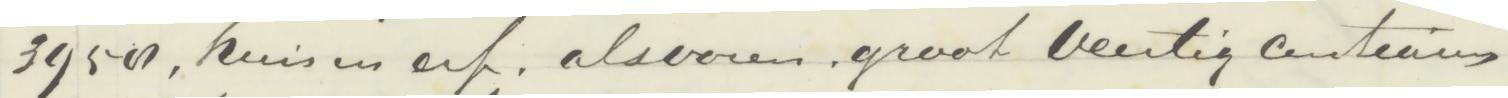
3958, huis en erf, alsvoren, groot veertig centiaren
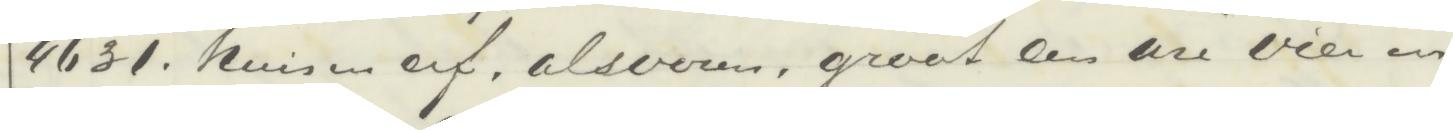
4631. huis en erf, alsvoren, groot een are vier en
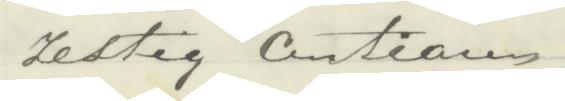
zestig centiaren
